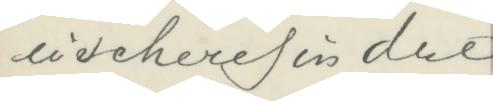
eischeres in deze
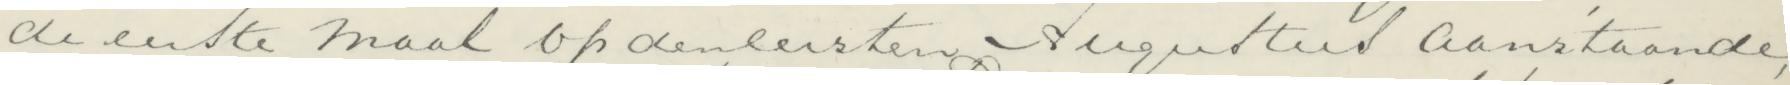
de eerste maal op den eersten Augustus aanstaande,
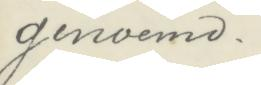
genoemd.
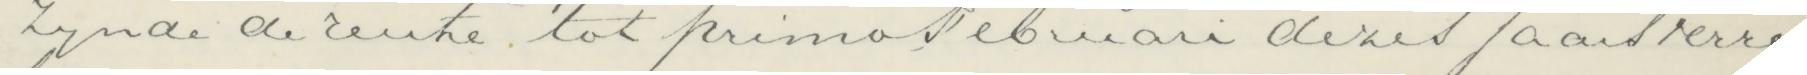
zynde de rente, tot primo Februari dezes Jaars verre
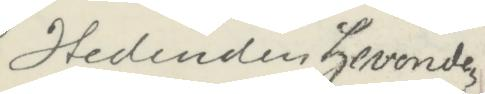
Heden den Zevenden
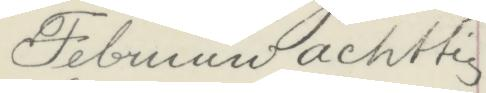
Februari achttien
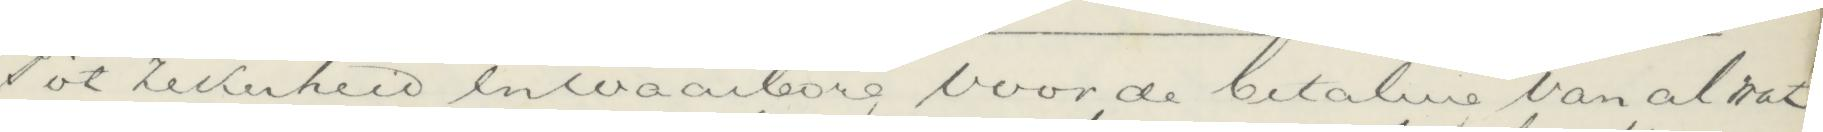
Tot zekerheid en waarborg voor de betaling van al dat
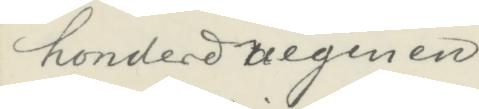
honderd negen en
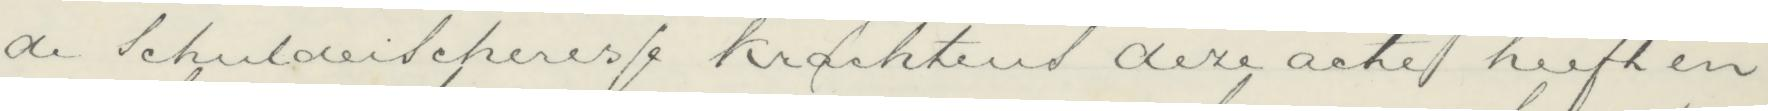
de schuldeischeresse krachtens deze acte heeft en
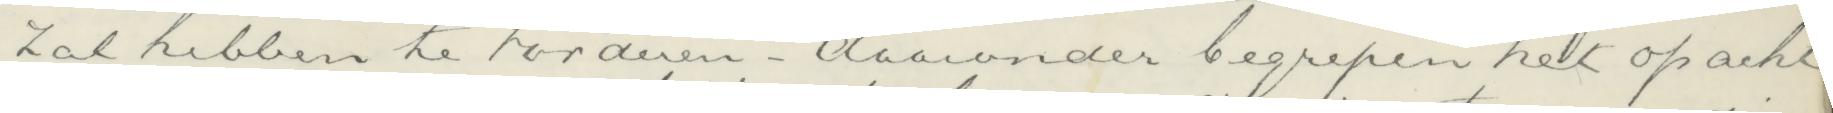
zal hebben te vorderen,- daaronder begrepen het op acht
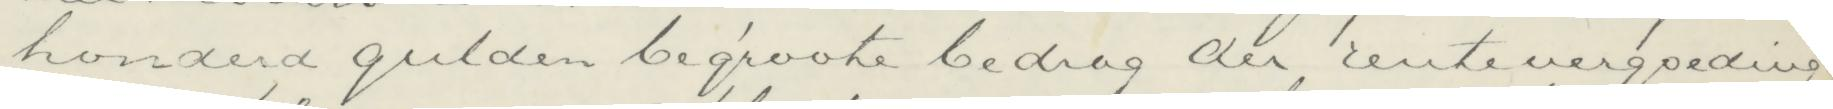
honderd gulden begroote bedrag der rente vergoeding
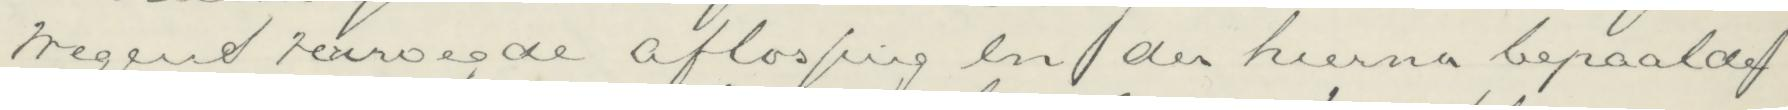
wegens vervroegde aflossing en der hierna bepaalde
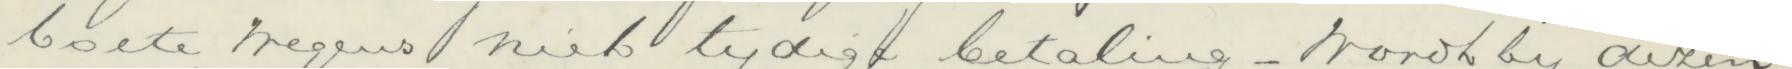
boete wegens niet tydige betaling - wordt by dezen
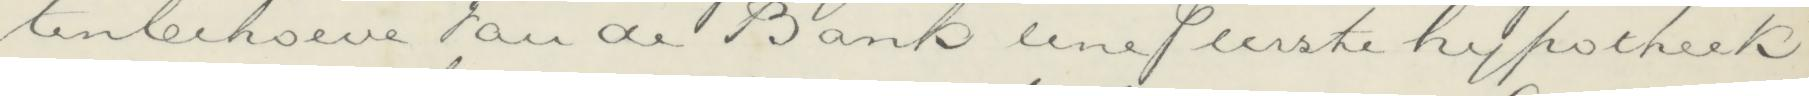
ten behoeve van de Bank eene eerste hypotheek
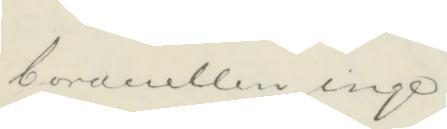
borderellen inge
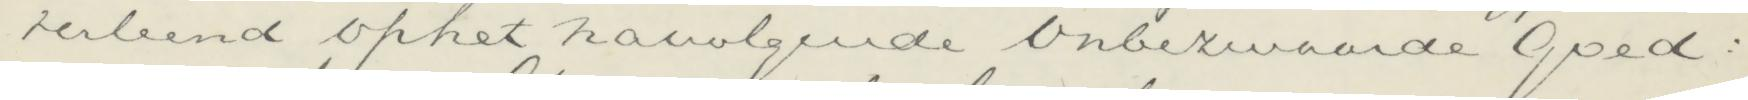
verleend op het navolgende Onbezwaarde Goed:
